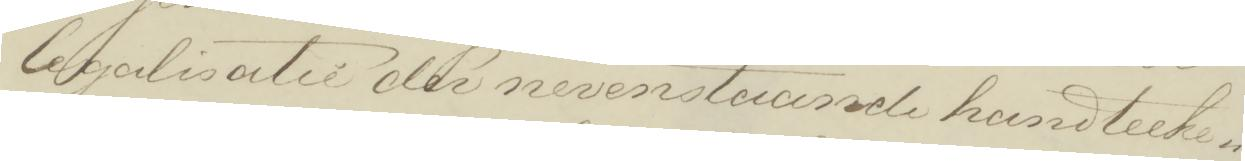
legalisatie der nevenstaande handteeke„
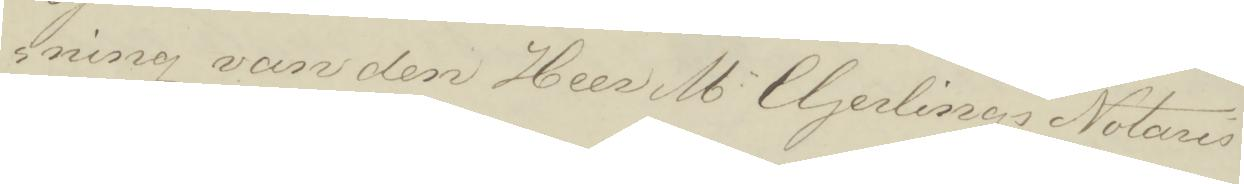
„ning van den Heer M: C Gerlings Notaris
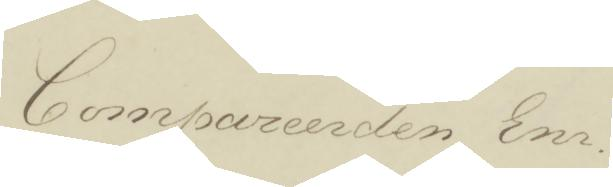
Compareerden Enz.
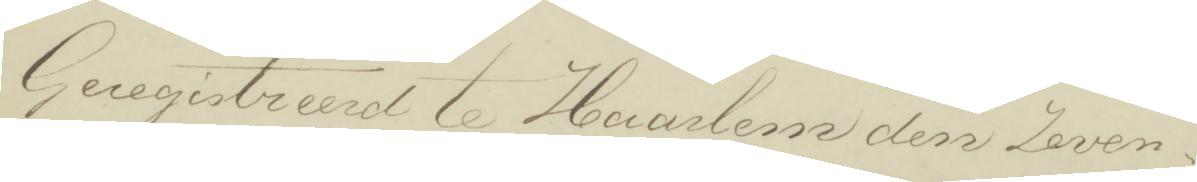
Geregistreerd te Haarlem den Zeven„
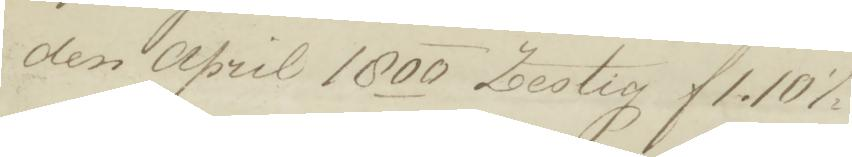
den April 1800 Zestig ƒ1.10½
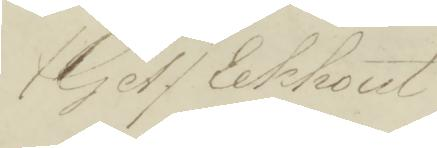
/Get/ Eekhout
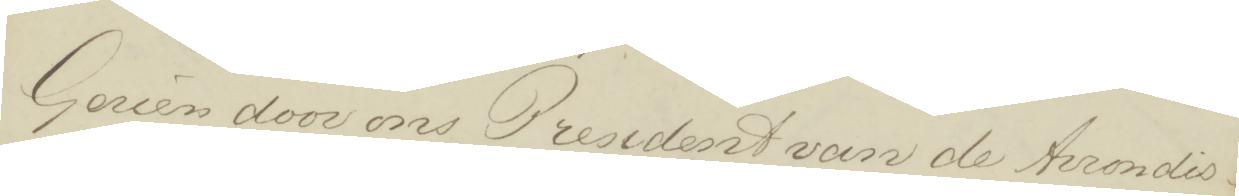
Gezien door ons President van de Arrondis
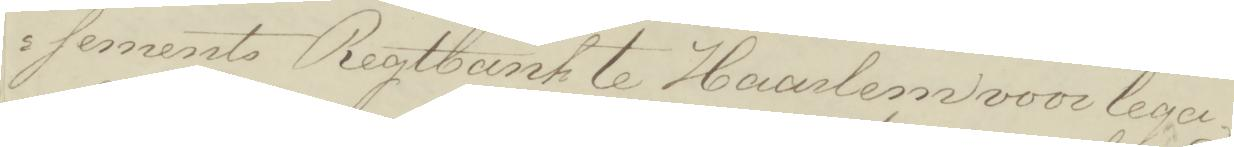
„sements Regtbank te Haarlem voor lega„
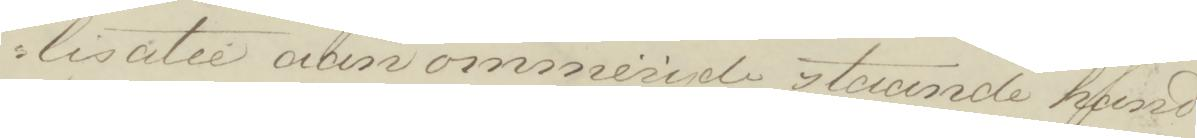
„lisatie aan ommezijde staande hand
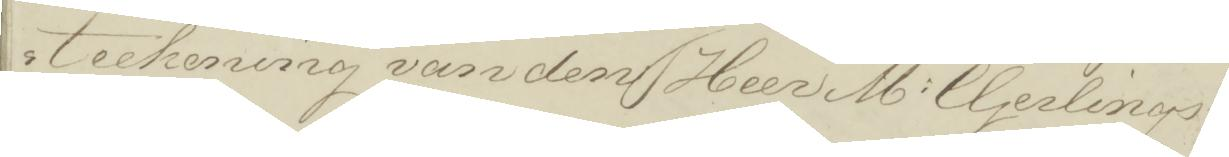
„teekening van den Heer M:C Gerlings
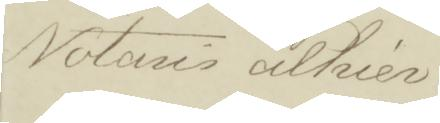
Notaris alhier
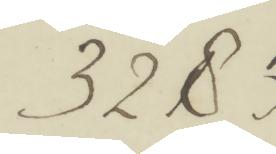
3285
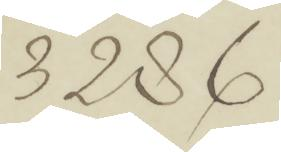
3286
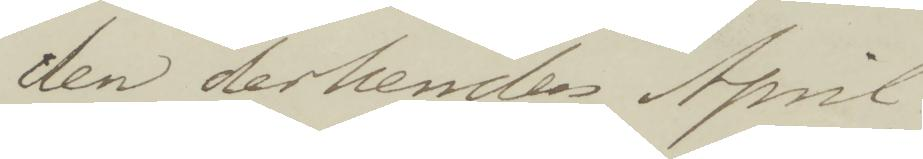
den dertienden April
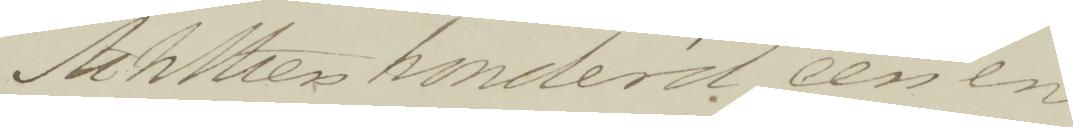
Achttien honderd een en
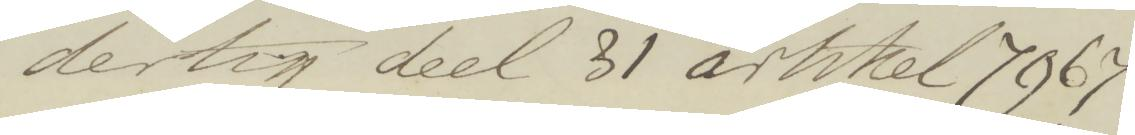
dertig deel 31 artitel 7967
